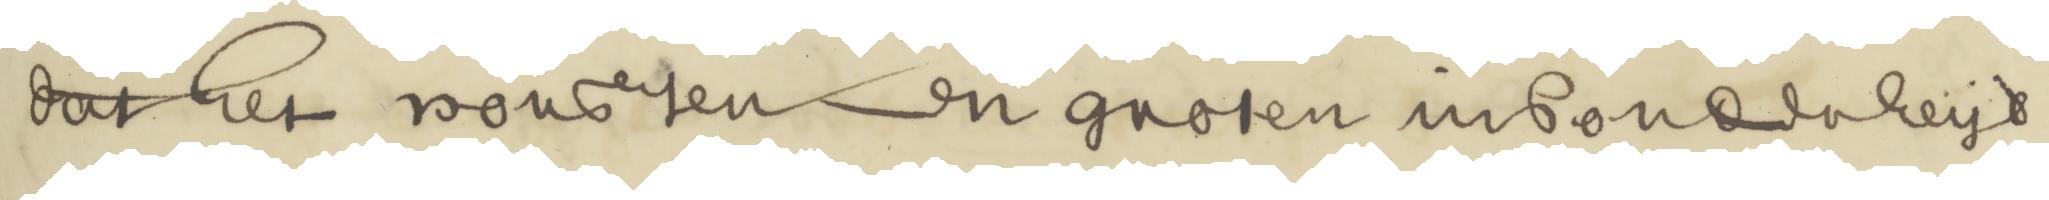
dat het vorsten en groten insonderheijd
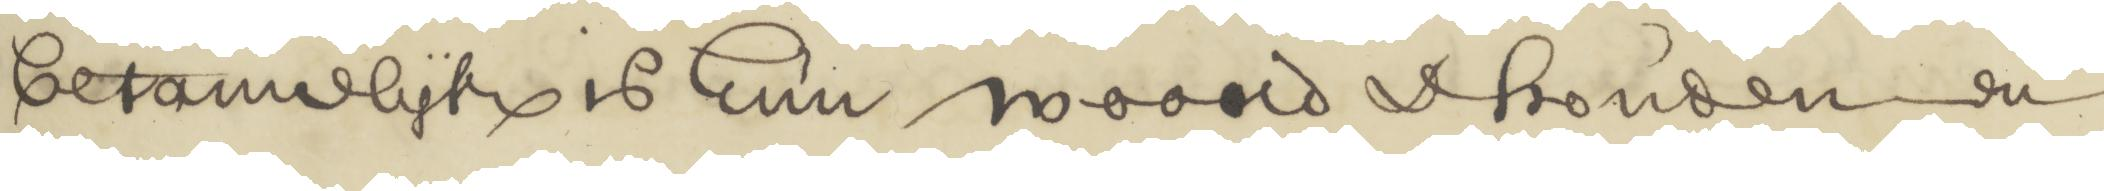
betamelijk is hun woord te houden en
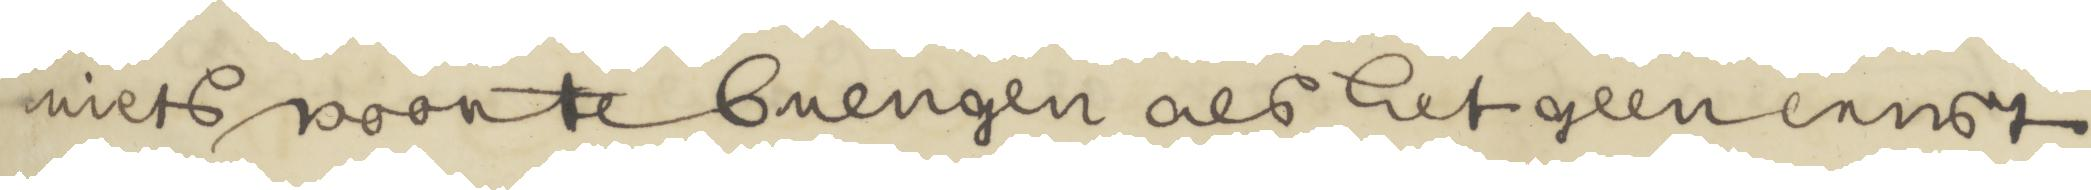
niets voor te brengen als het geen ernst
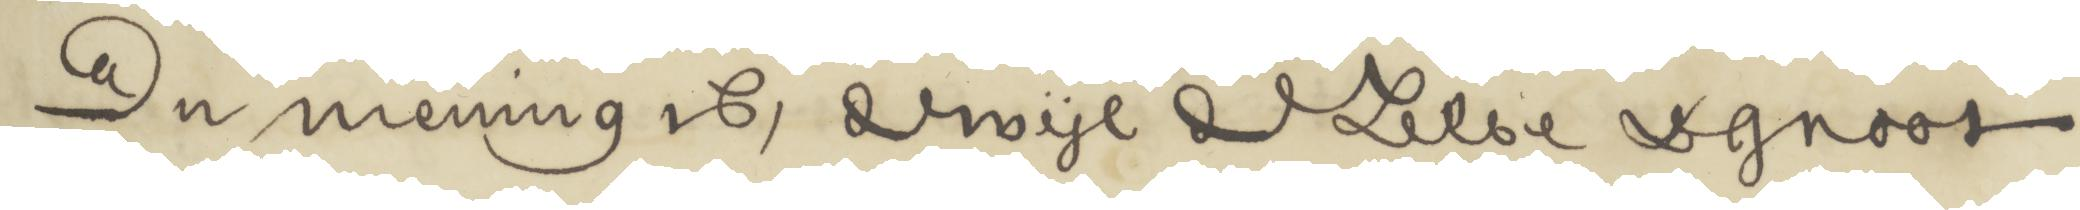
En mening is, dewijl dezelve te groot
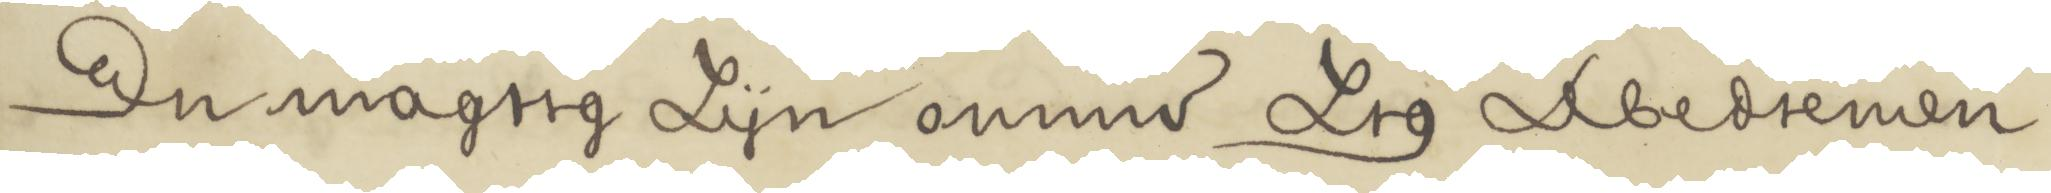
En magtig zijn omme zig tebedienen
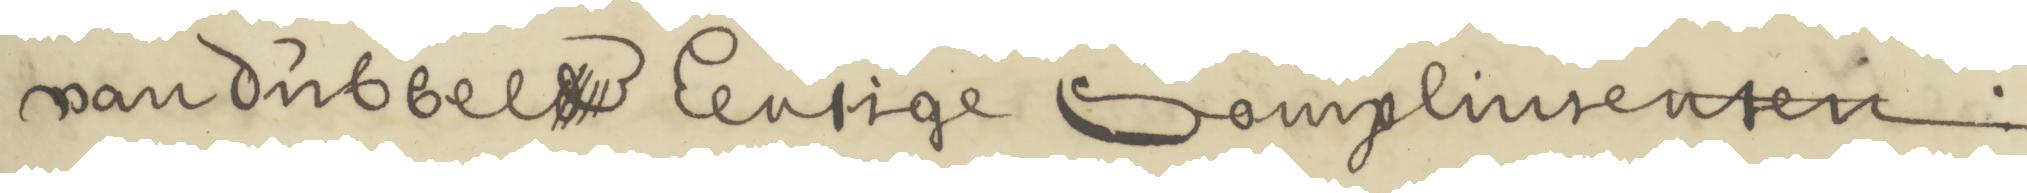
van dubbeld hertige Complimenten:
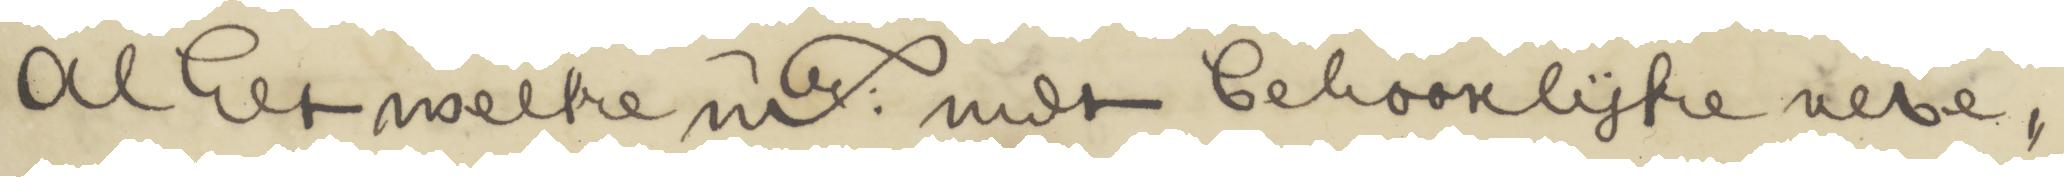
al het welke uE: met behoorlijke reve„
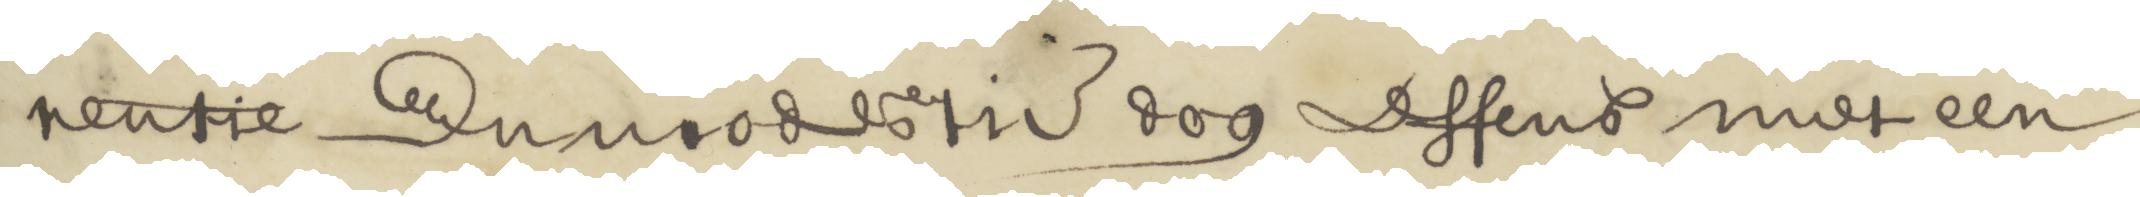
rentie En modestie dog teffens met een
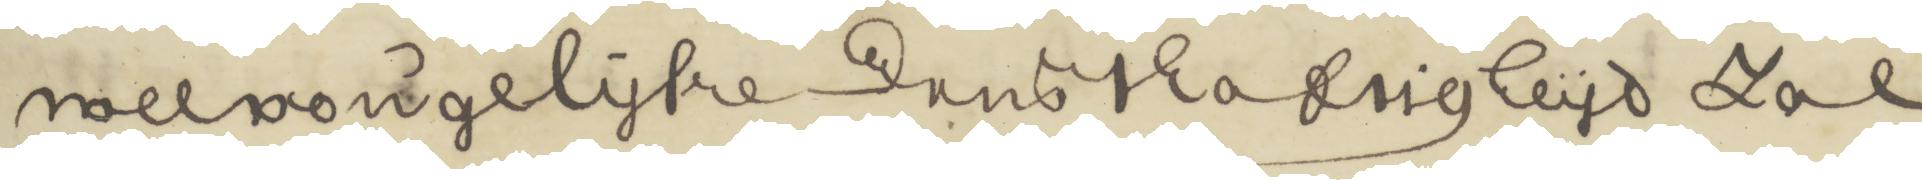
welvougelijke Ernsthaftigheijd zal
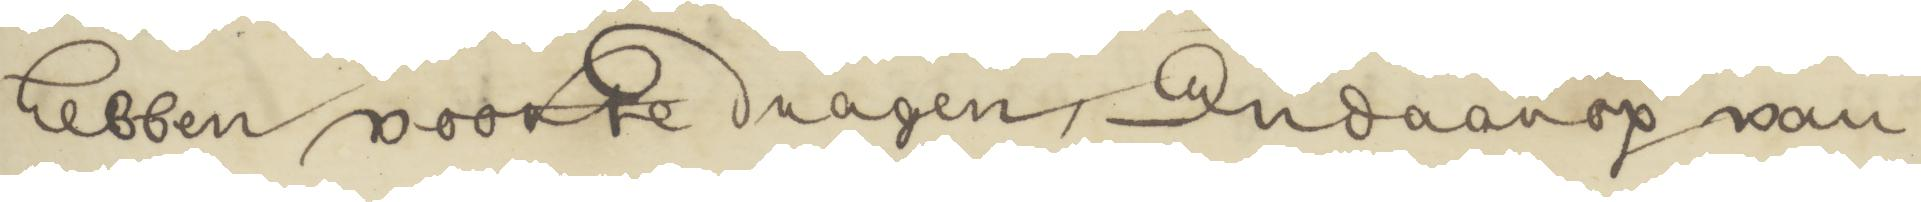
hebben voor te dragen, En daarop van
